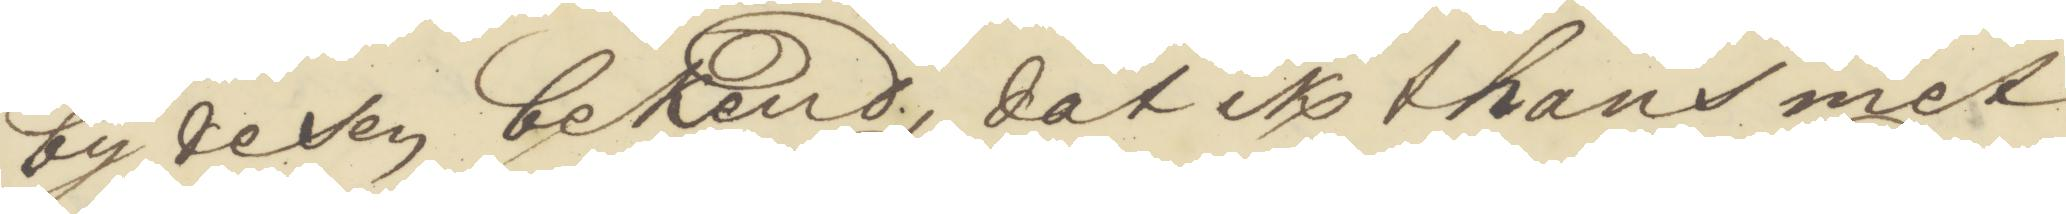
bij desen bekend, dat ik thans met
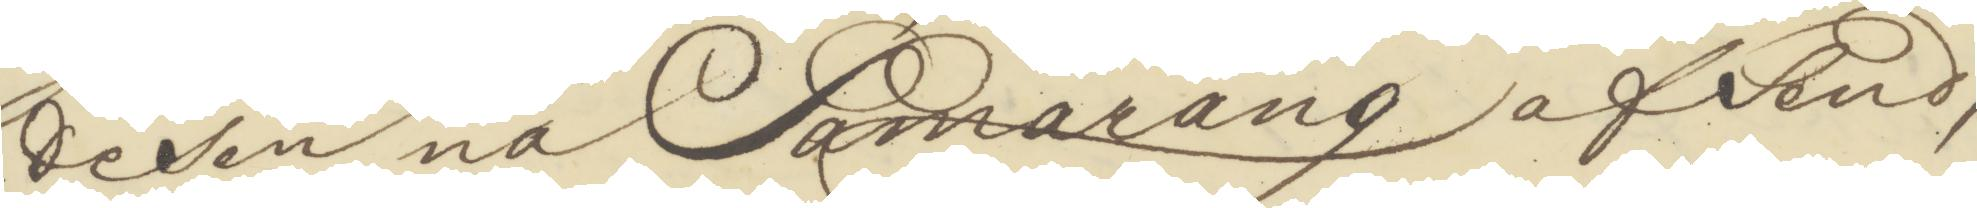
desen na Samarang afsend,
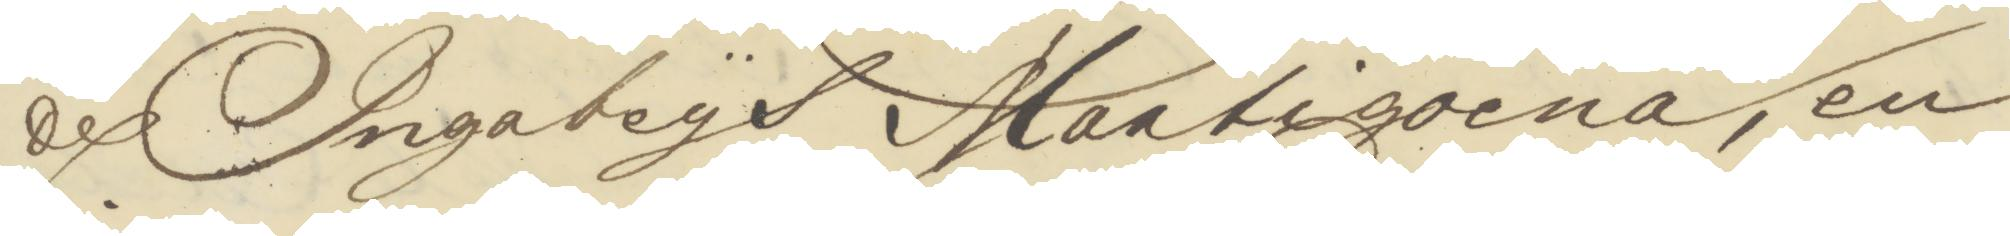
de Jngabeijs Martigoena, en
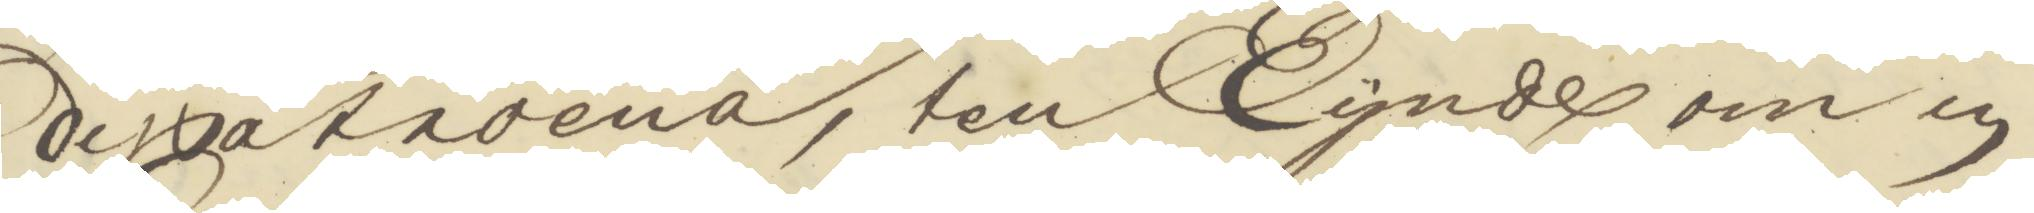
dipatroena, ten Eijnde om in
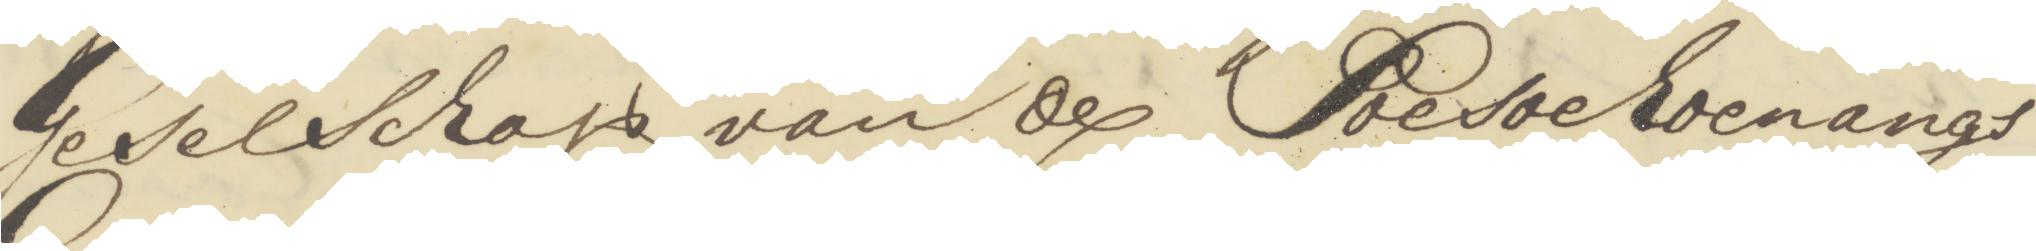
Geselschap van de Soesoehoenangs
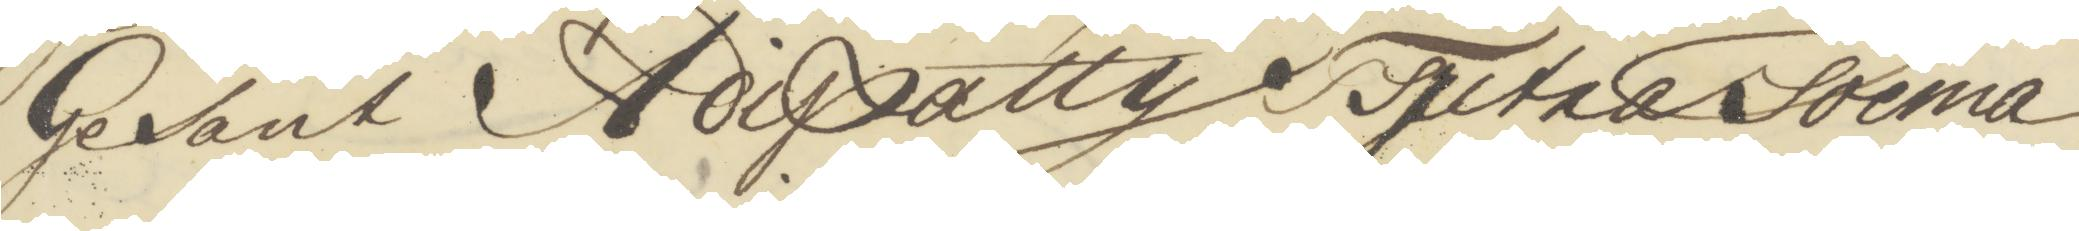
Gesant Adipattij Tsjitra soema
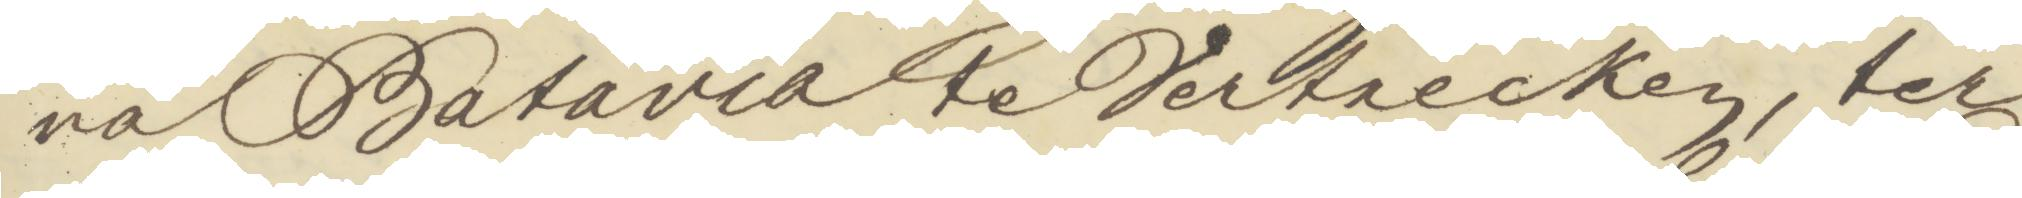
na Batavia te Vertrecken, ter
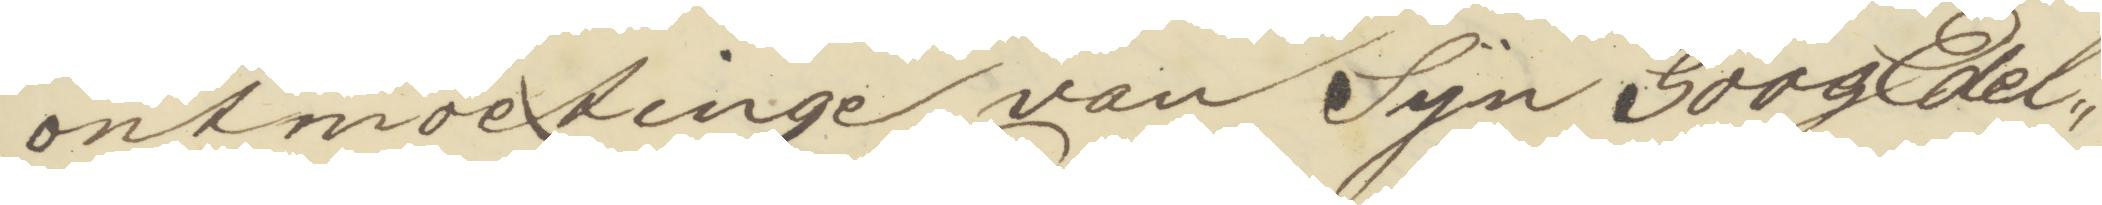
ontmoetinge van sijn hoog Edel„
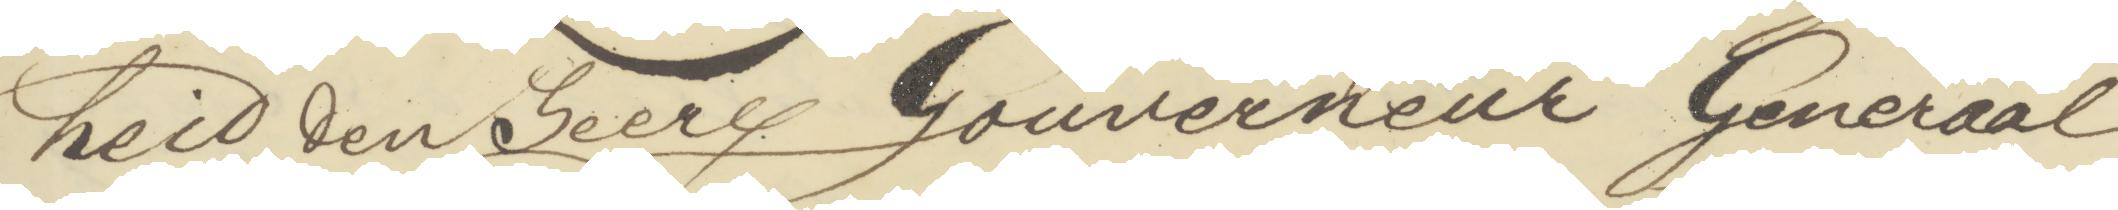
heid den heere Gouverneur Generaal
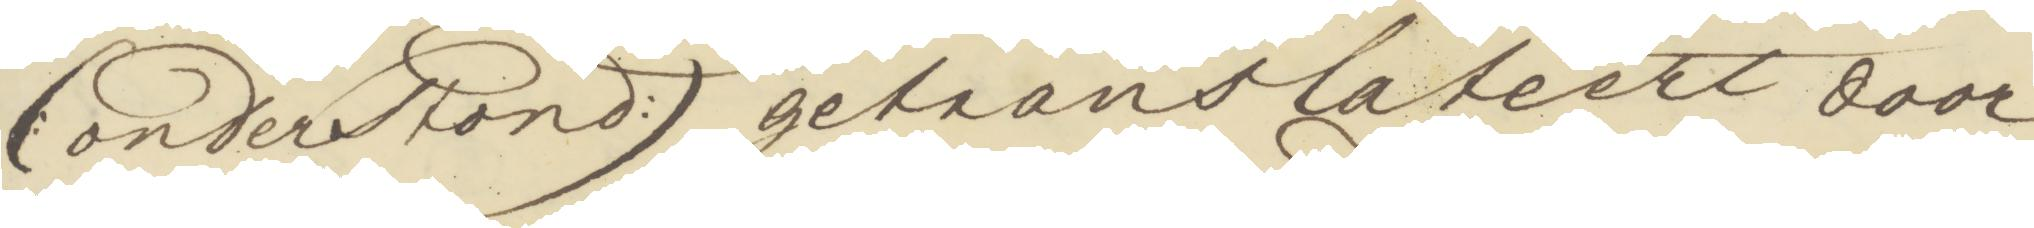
(:onderstond:) getranslateert door
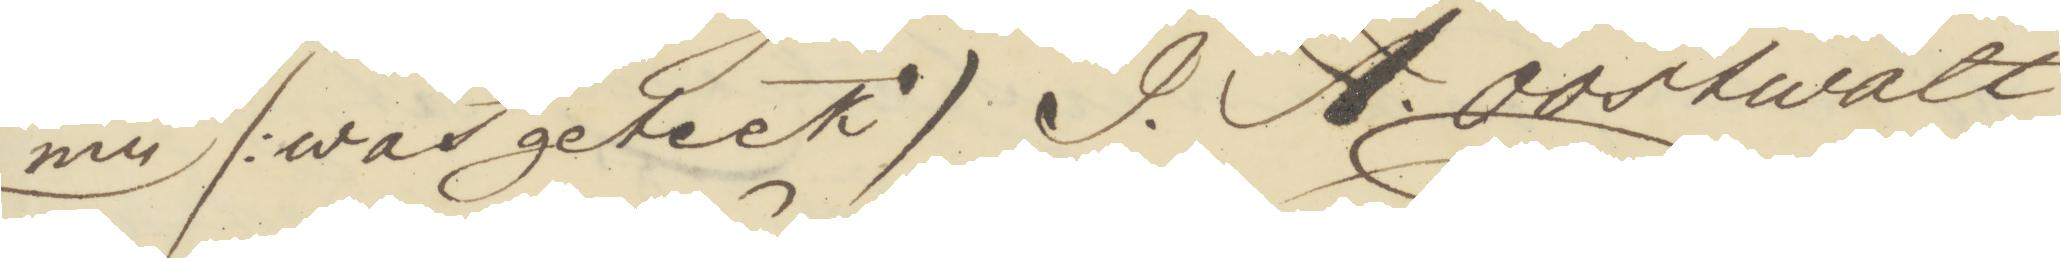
mij /:was geteekt/ I. A. oostwalt
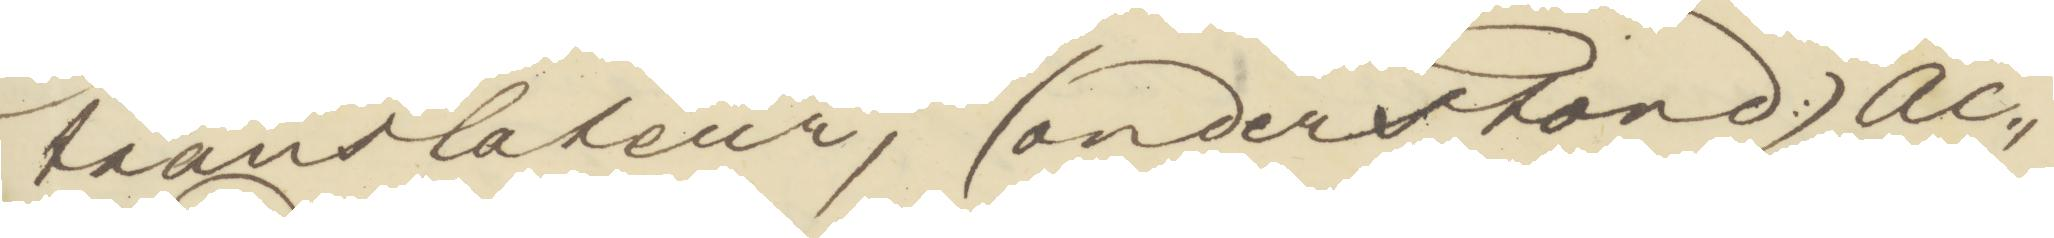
translateur, (onderstond:) ac„
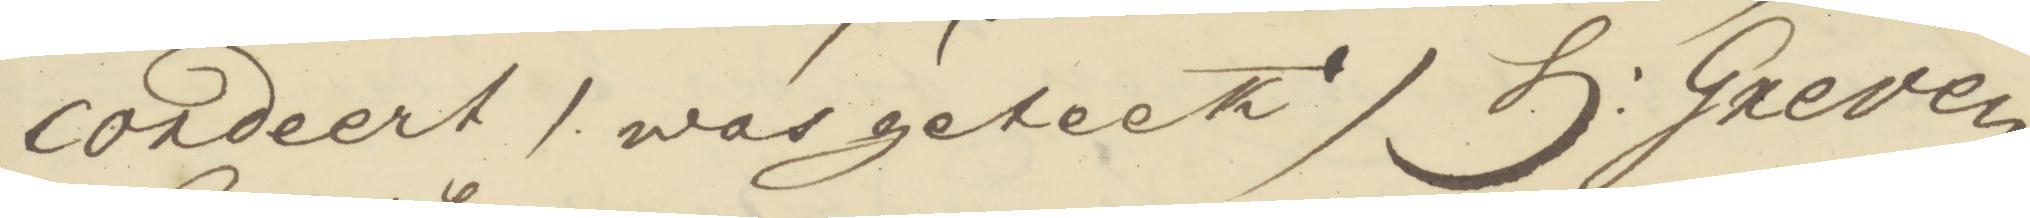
cordeert /was geteekt/ H: Greven
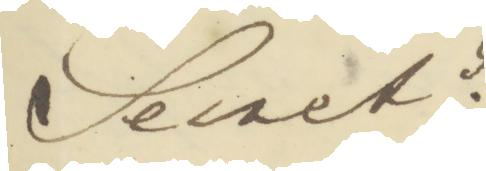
secret.s
